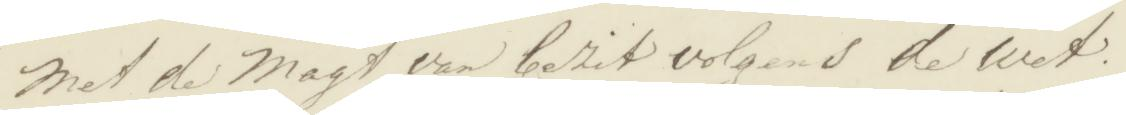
met de Magt van bezit volgens de wet.
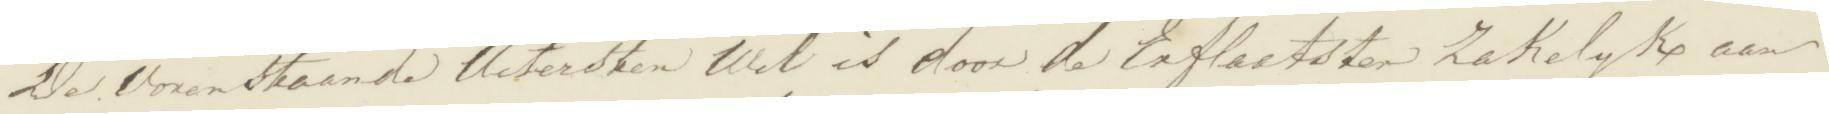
De Vorenstaande Uitersten Wil is door de Erflaatster Zakelyk aan
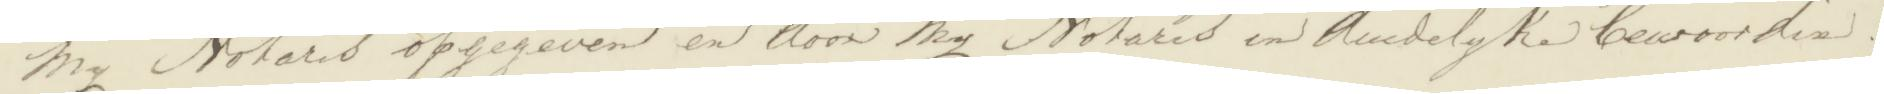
My Notaris opgegeven en door My Notaris in duidelijke bewoordin.
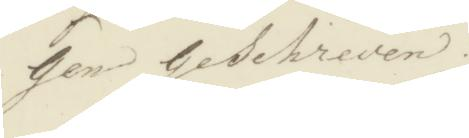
gen geschreven.
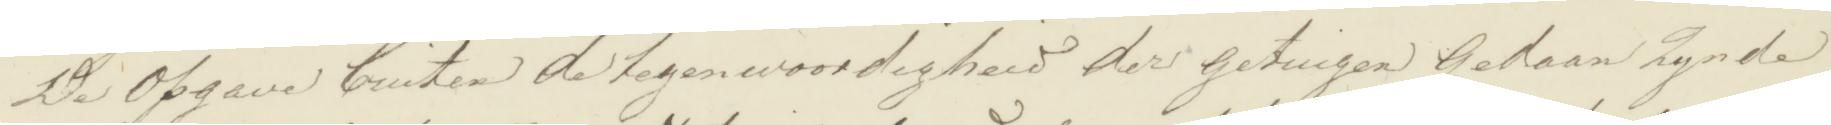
De Opgave buiten de tegenwoordigheid der getuigen Gedaan Zynde
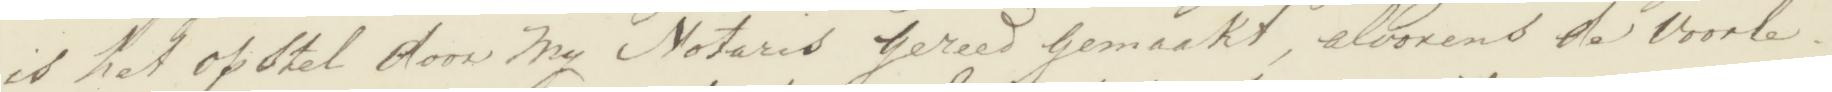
is het opstel door My Notaris Gereed Gemaakt, alvorens de Voorle„
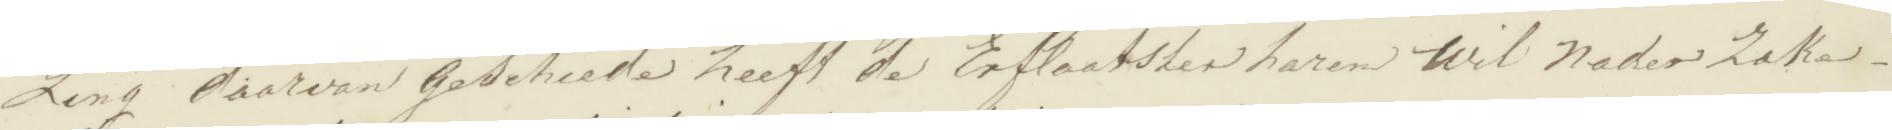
Zing daarvan geschiede heeft de Erflaatster haren Wil Nader Zake-
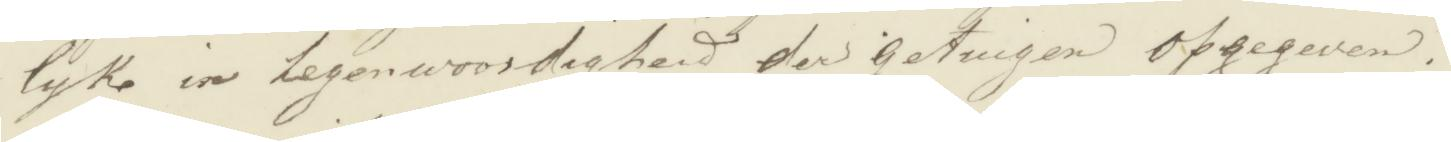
lyk in tegenwoordigheid der getuigen opgegeven.
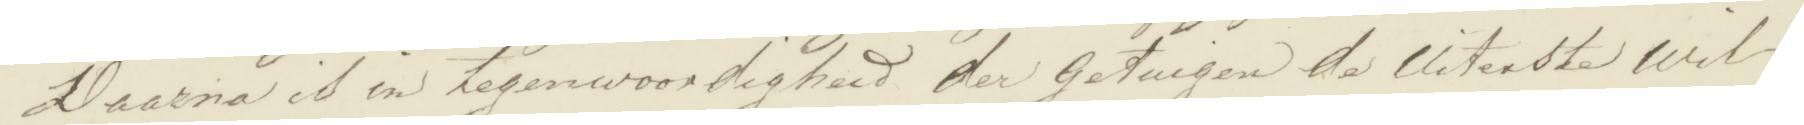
Daarna is in tegenwoordigheid der getuigen de Uiterste Wil
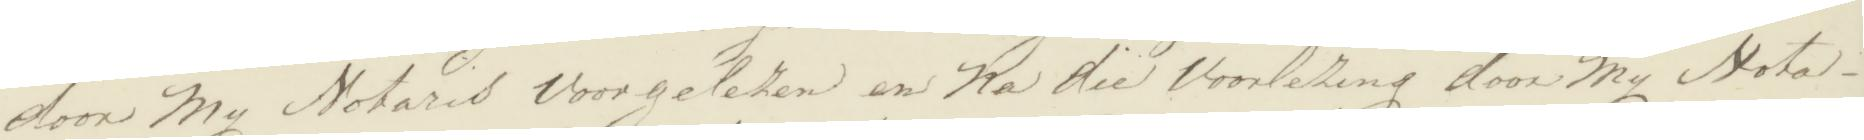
door My Notaris voorgelezen en Na die Voorlezing door my Nota=
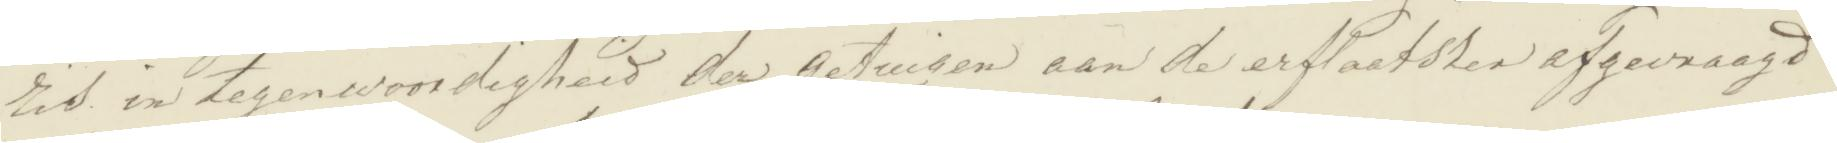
ris. in tegenwoordigheid der getuigen aan de erflaatster afgevraagd
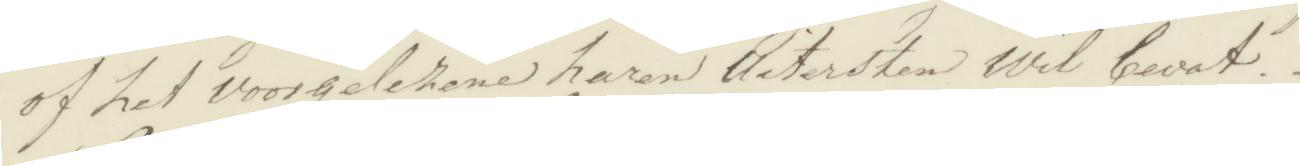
of het voorgelezene haren Uitersten Wil bevat.
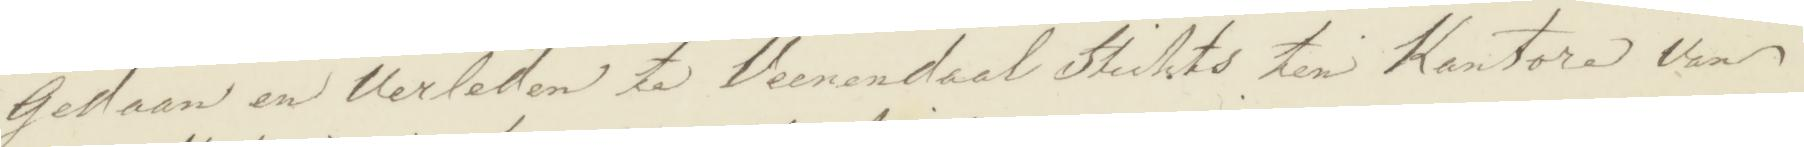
Gedaan en Verleden te Veenendaal Stichts ten Kantore van
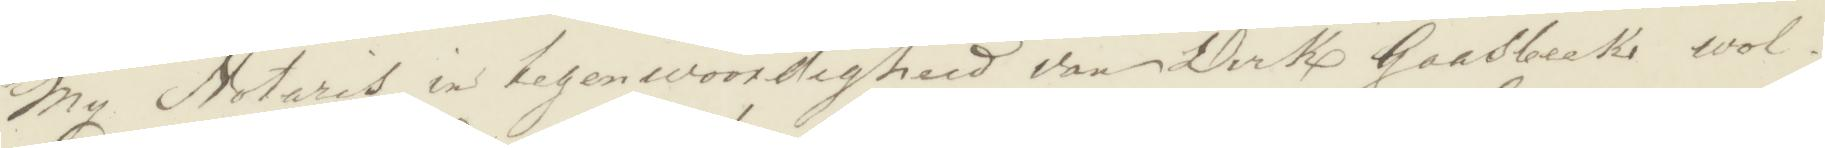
My Notaris in tegenwoordigheid van Dirk Gaasbeek wol.
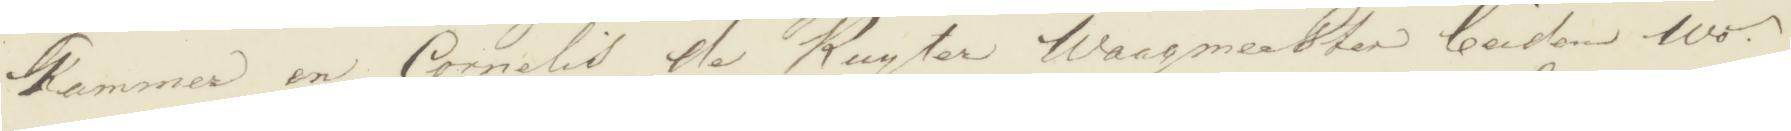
Kammer en Cornelis de Ruyter Waagmeester beiden Wo-
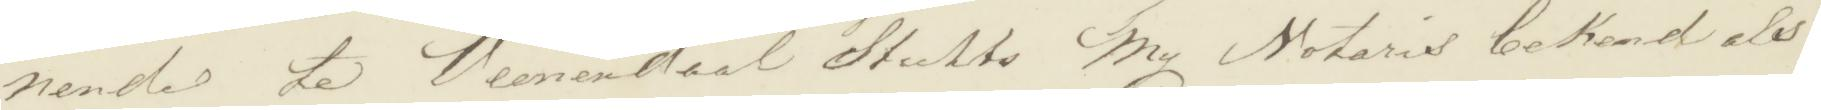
nende te Veenendaal Stichts Mij Notaris bekend als
